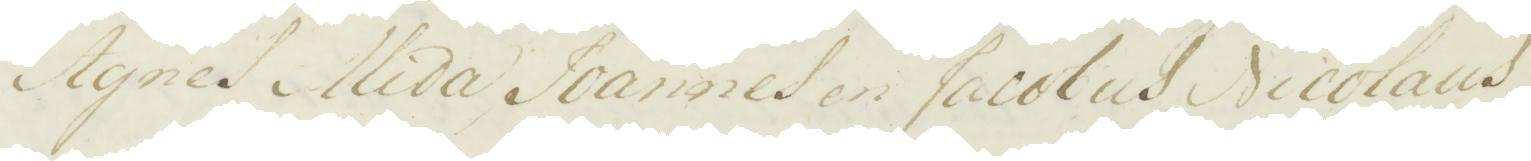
Agnes Alida Joannes en Jacobus Nicolaus
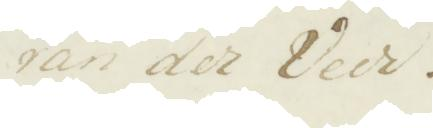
van der Veer
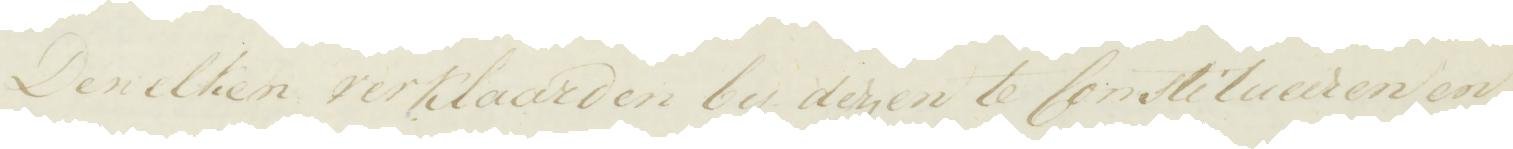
Dewelken verklaarden by dezen te Constitueeren en
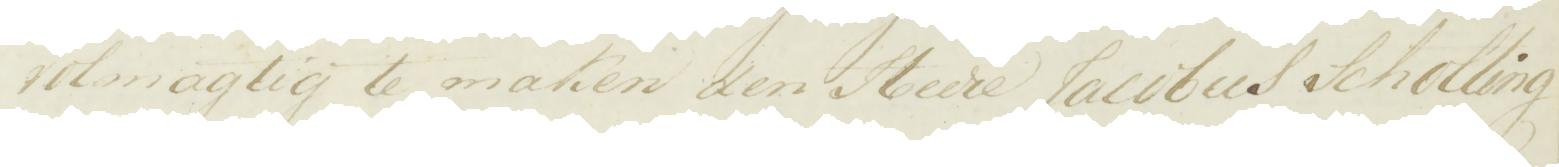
volmagtig te maken den Heere Jacobus Scholting
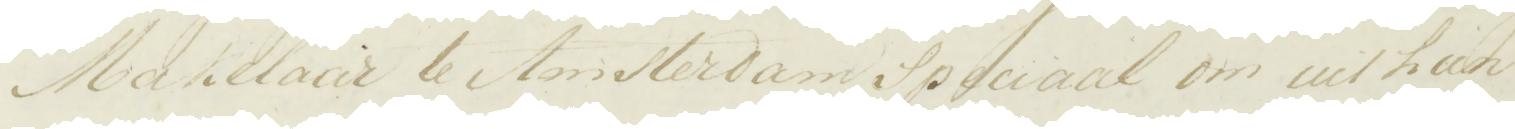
Makelaar te Amsterdam speciaal om uit hun
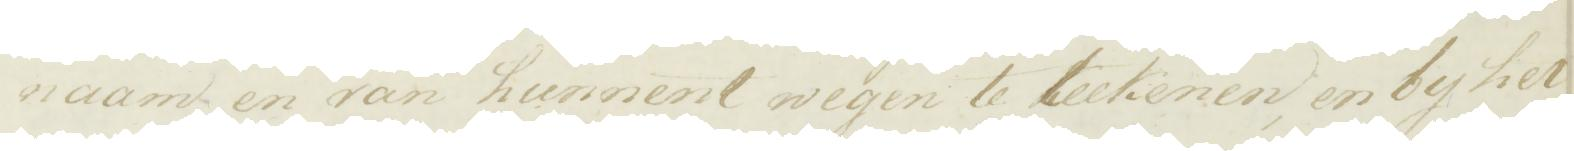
naam en van hunnent wegen te teekenen, en by het
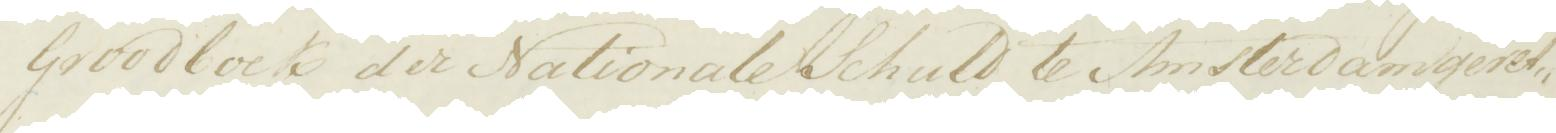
Groodboek der Nationale Schuld te Amsterdam geves„
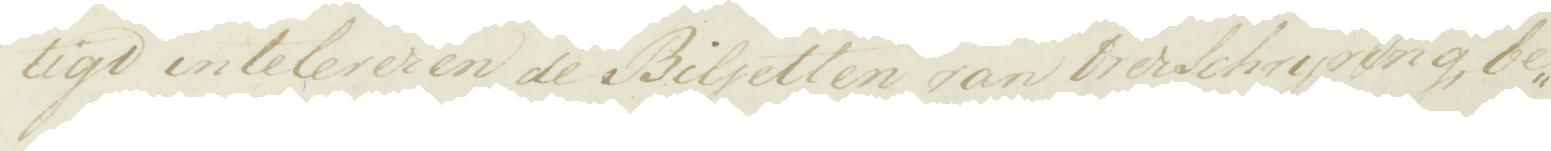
tigd inteleveren de Biljetten van Overschrijving, be„
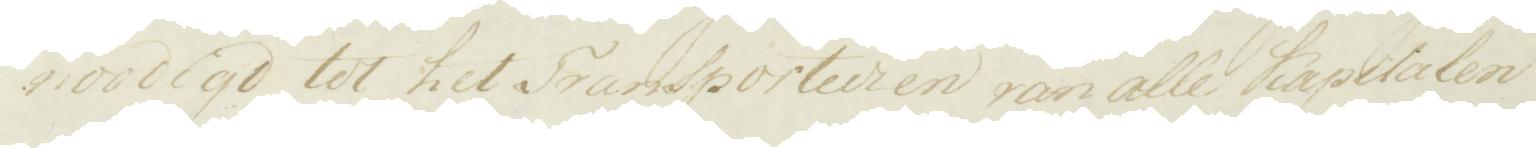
noodigd tot het Transporteeren van alle Kapitalen
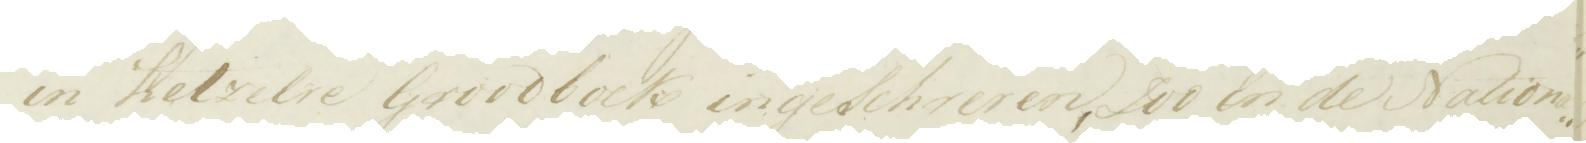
in hetzelve Groodboek ingeschreven, zoo in de Nationa„
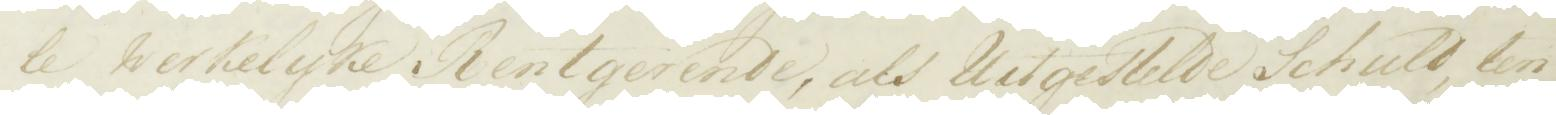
le werkelijke Rentgevende, als Uitgestelde Schuld, ten
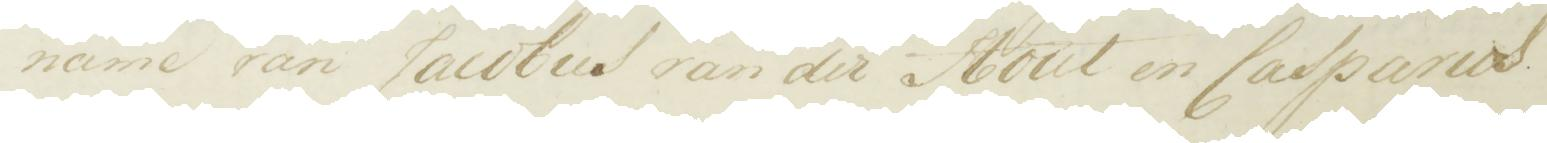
name van Jacobus van der Hout en Casparus
